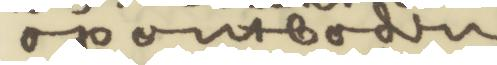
op ontboden
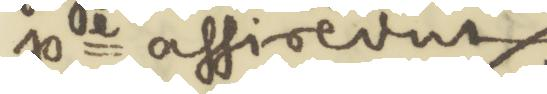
p=l assistent
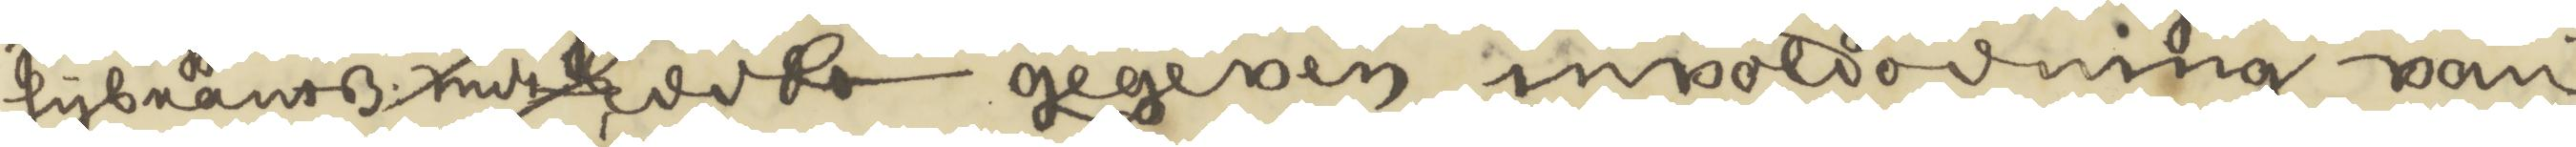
Sijbrantss: met heeft gegeven involdoening van
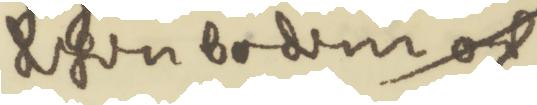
desen bodem over
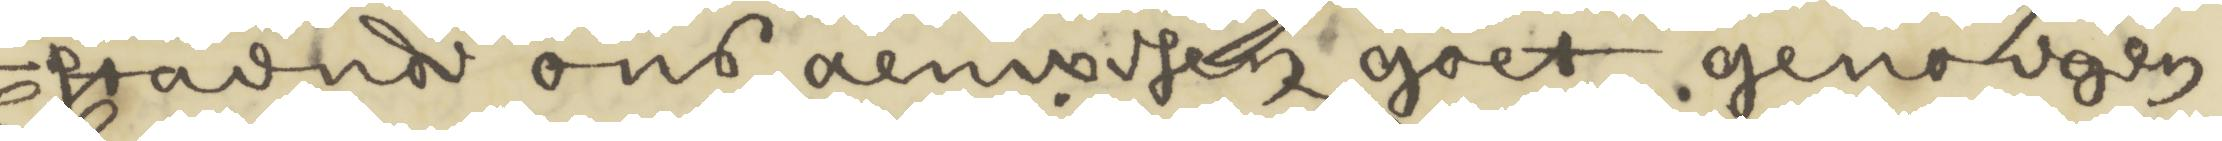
staende ons aenwesen goet genoegen
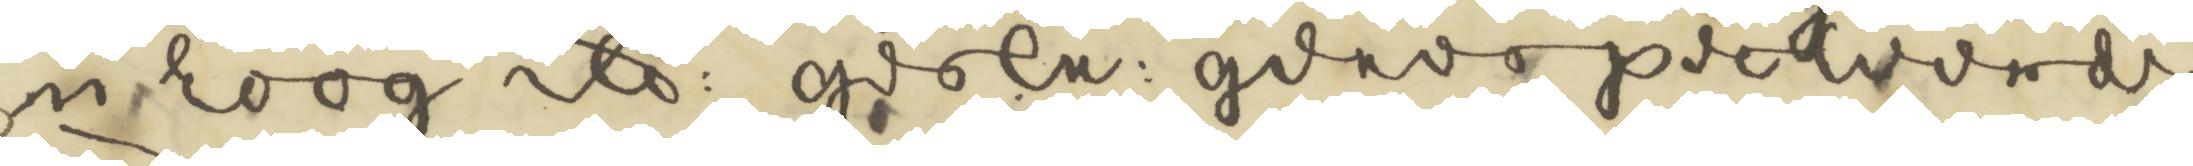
u hoog Ed: gestr: geres pecteerde
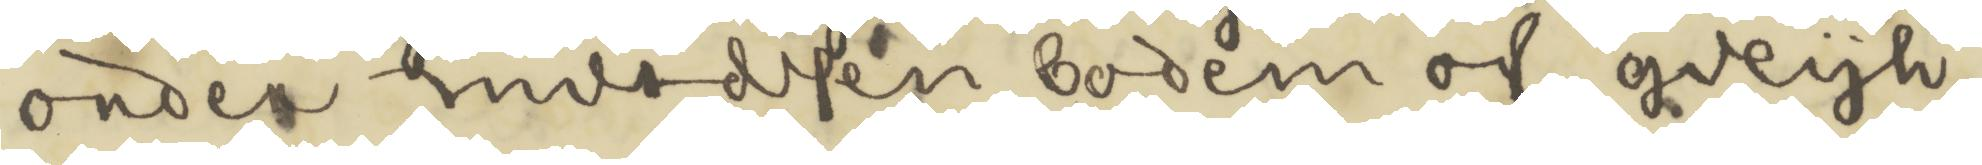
onder met desen bodem of gelijk
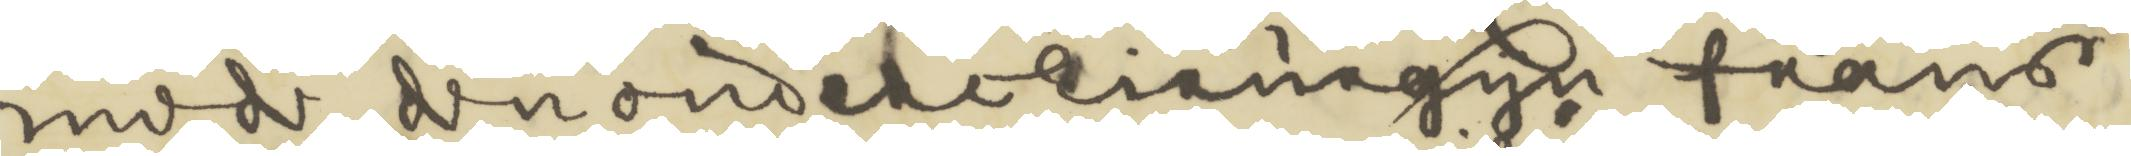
mede den onderchirurgijn frans
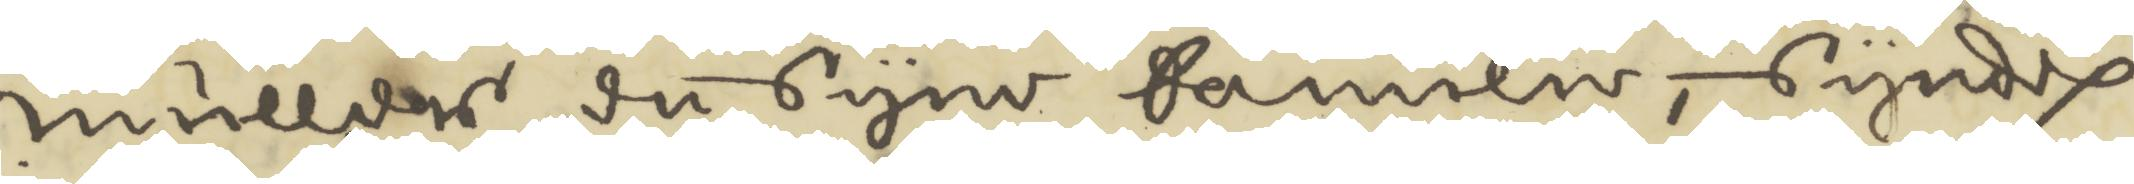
mullers en sijne familie, sijnde
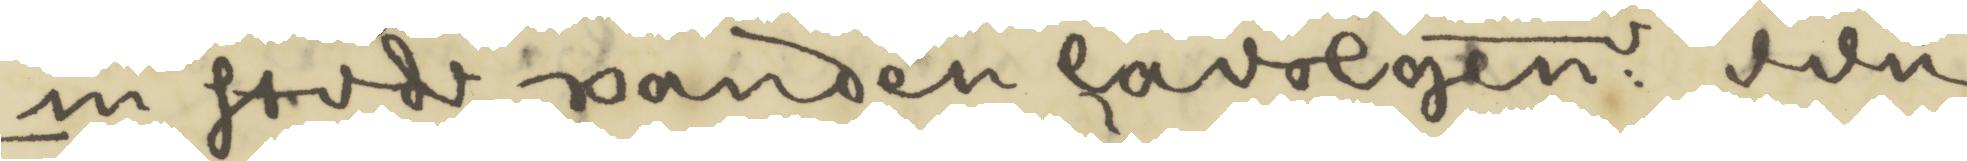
in stede van den laest gen:e een
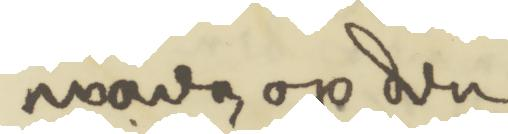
waer, op den
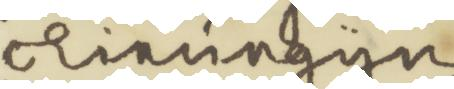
chirurgijn
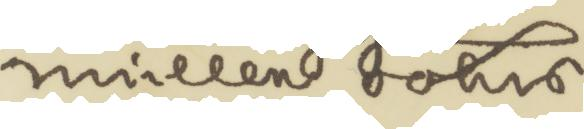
muller ook is
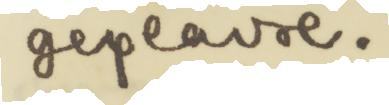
geplaest.
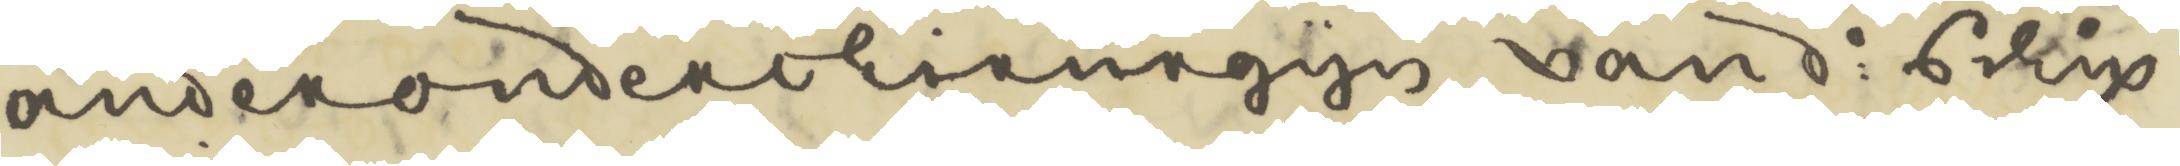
ander onder chirurgijn van d:o schip
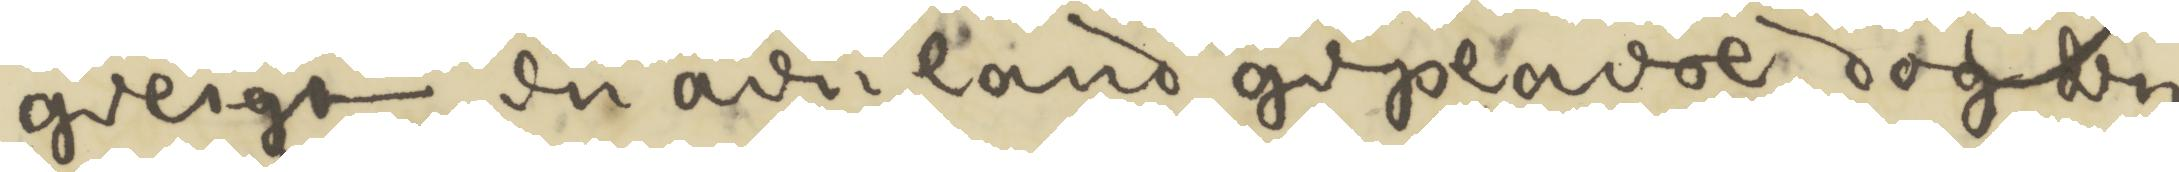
geligt en aen land geplaest dog den
